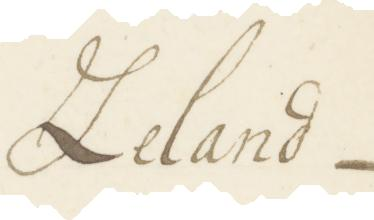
Zeland
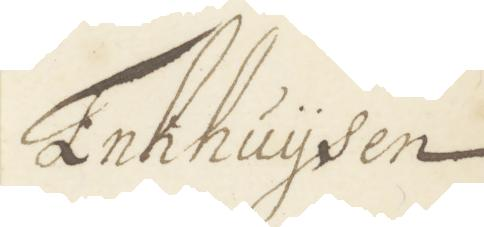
Enkhuijsen
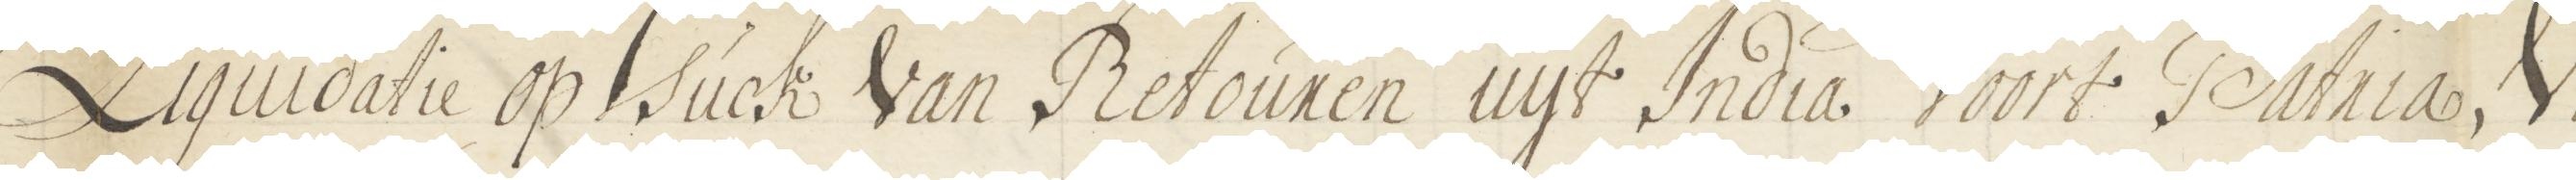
Liquidatie op 't suck van Retouren uijt India voor't Patria, V
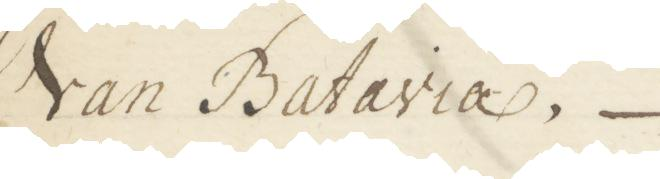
van Batavia.-
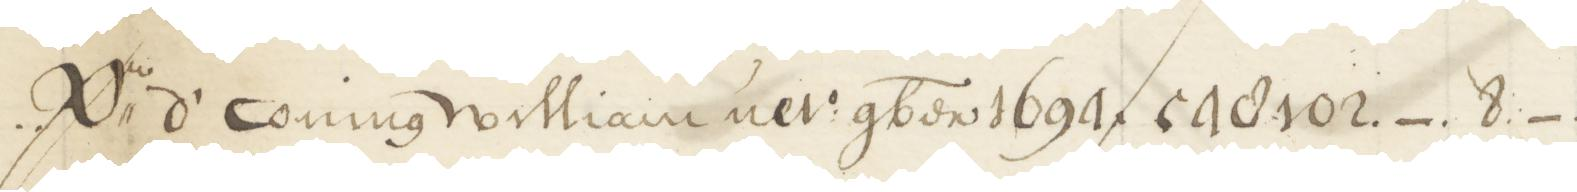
P„r d’ coning William uev: 9ber 1694 ƒ 548102.-.8.-
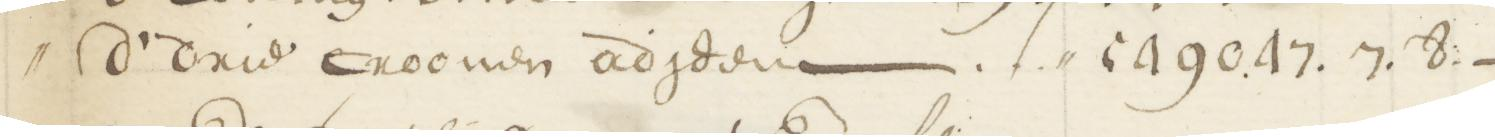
„ d' drie croonen adjdem „ 5490.47.7.8.-
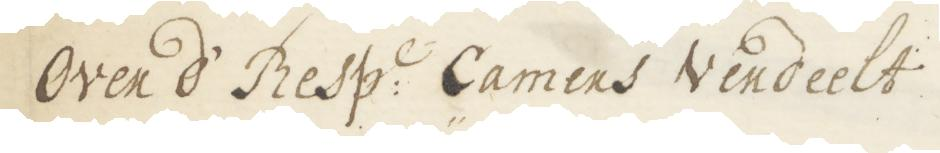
over d’ Resp:e camers verdeelt
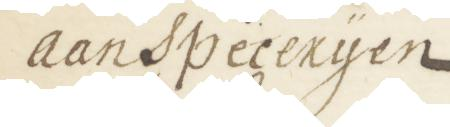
aanspecerijen
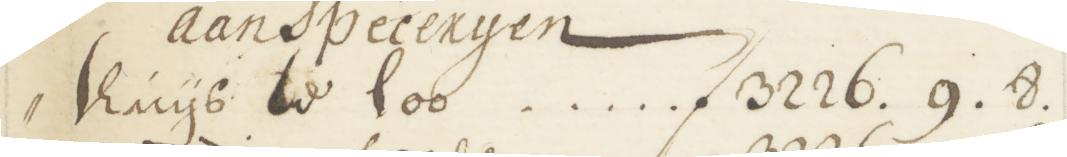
„ thuijs te loo . . ... ƒ 3226. 9.8.
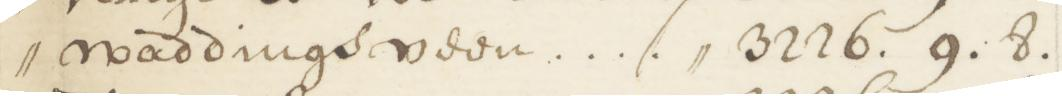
„ waddingsveen . . . . „ 3226.9.8.
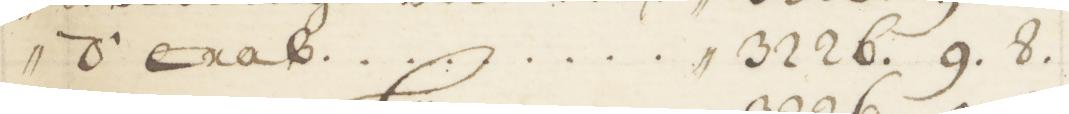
„ d' crab. . . . . . . . . „ 3226.9.8.
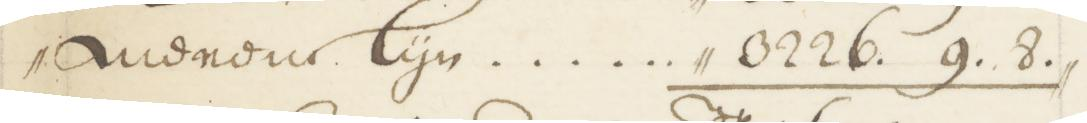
„ merenstijn . . . . .. „ 3226.9.8.„
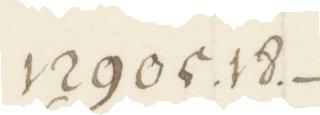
12905.18.-
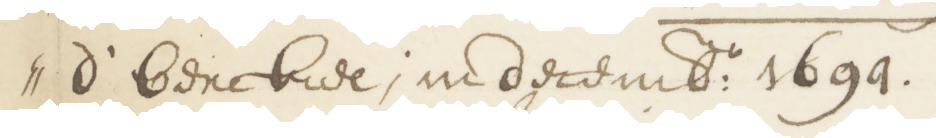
„ d’ berckel, in decemb:r 1694.
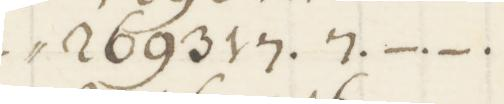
. „ 269317.7. -.-.
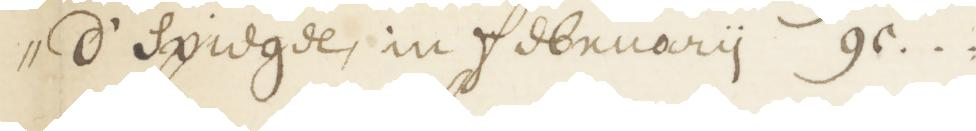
„ d’ Spiegel, in februarij 95. . .
